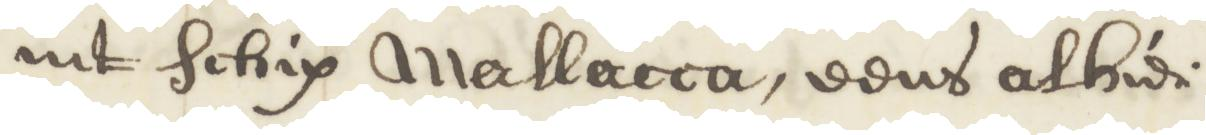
int schip Mallacca, eens alhier
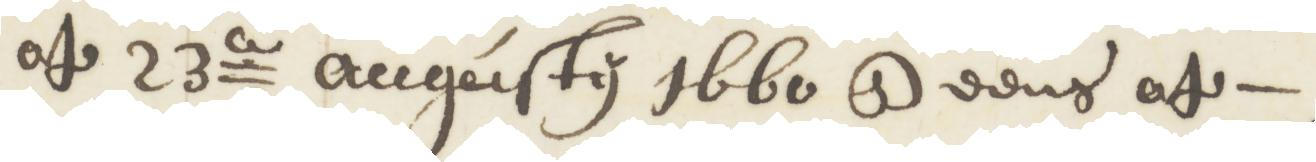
op 23=e augustij 1660 ende eens op —
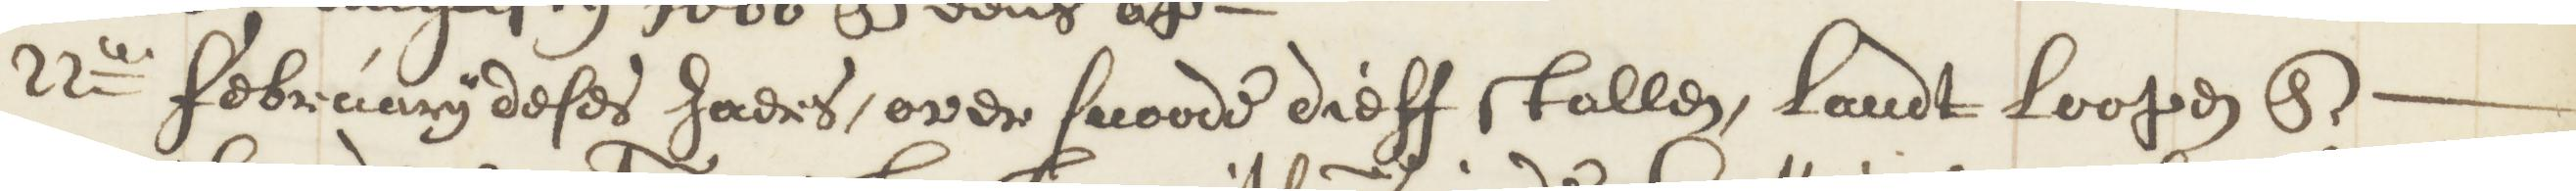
22=e februarij deses Jaers, over snoode dieff stallen, landt loopen ende —
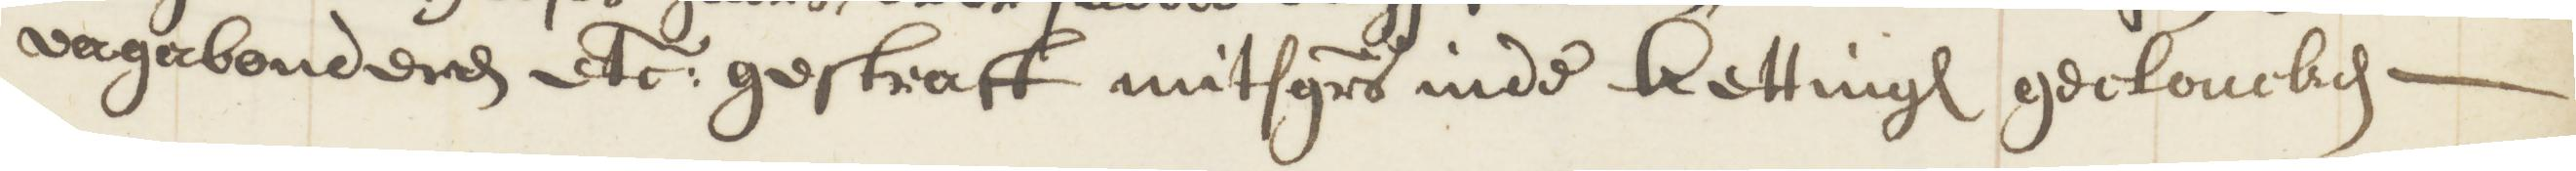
vagabonderen etc: gestraft mitsgrs inde kettingh gecloncken —
